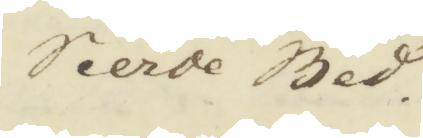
Vierde Bed.
